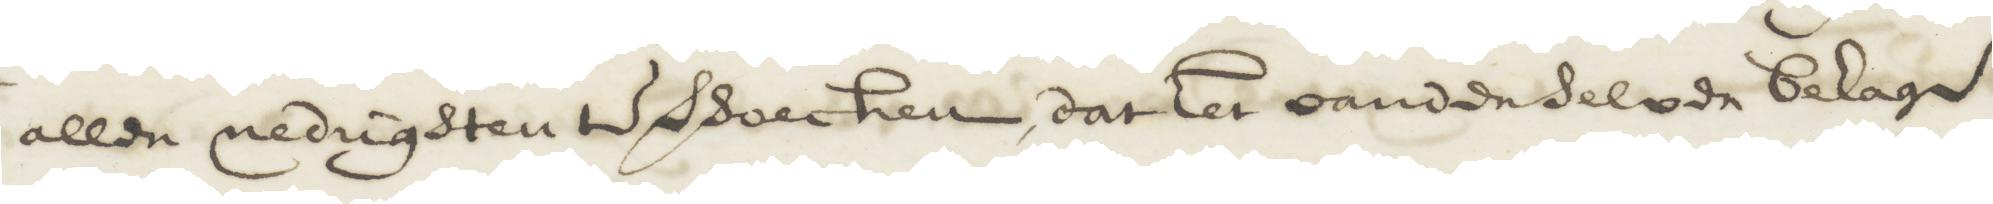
allen nedrigsten te versoecken, dat het van derselver behage
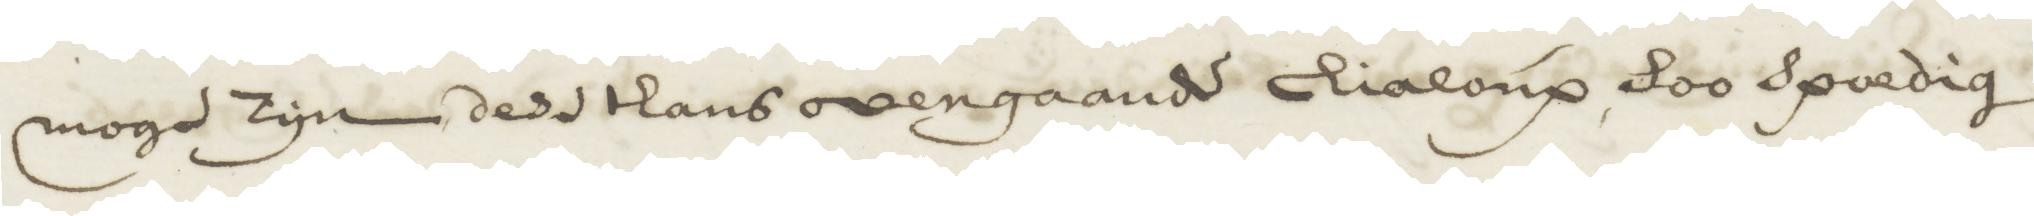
moge zijn, dese thans overgaande chialoup, soo spoedig
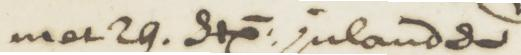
met 29. stx: jnlande
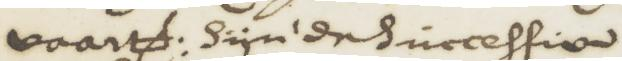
voortver: sijn 'er successive
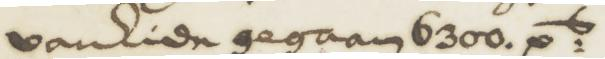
van hier gegaan 6300. p:s
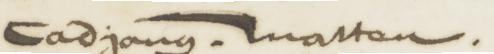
cadjang-matten.
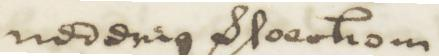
nederig versoeck om
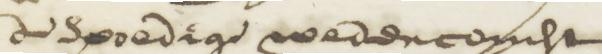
de spoedige wedercomst
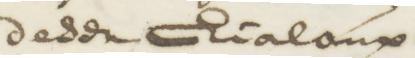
deser chialoup
